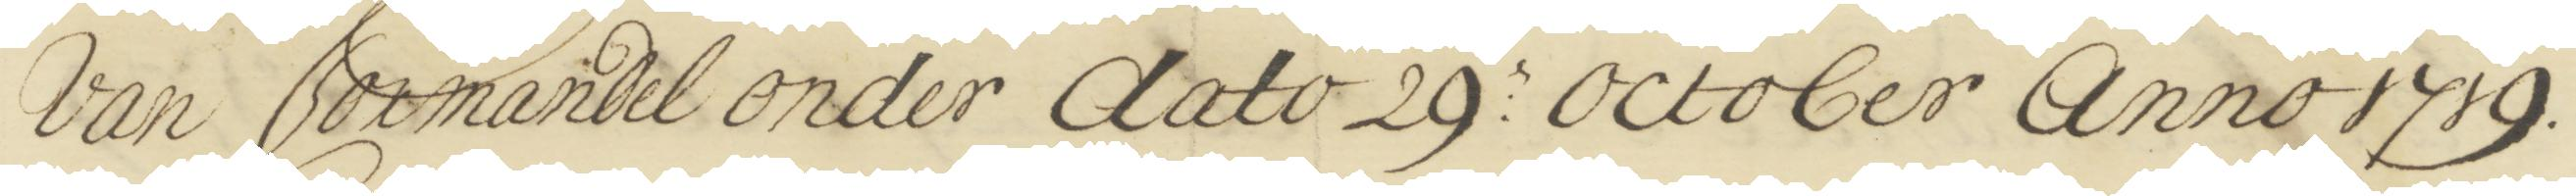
Van Cormandel onder dato 29:e October Anno 1719.
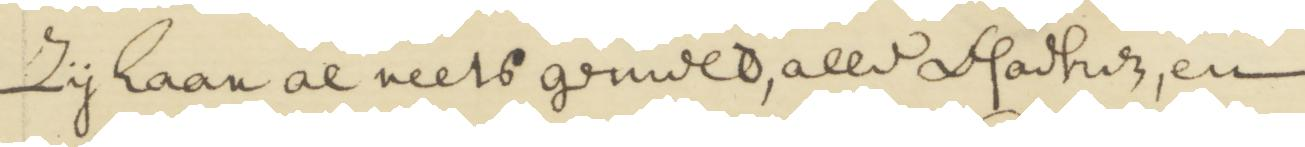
zij haar al reets gemeld, alle versoeken, en
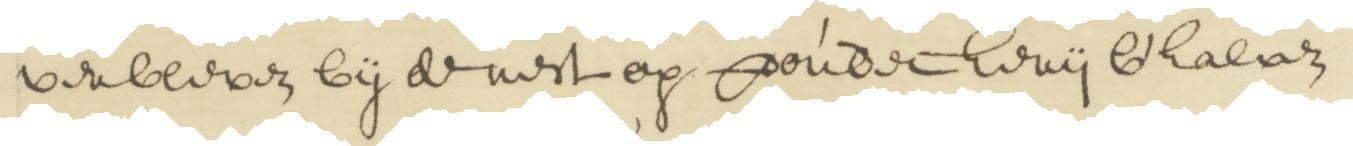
verbleven bij de rest op poudecherij b'halven
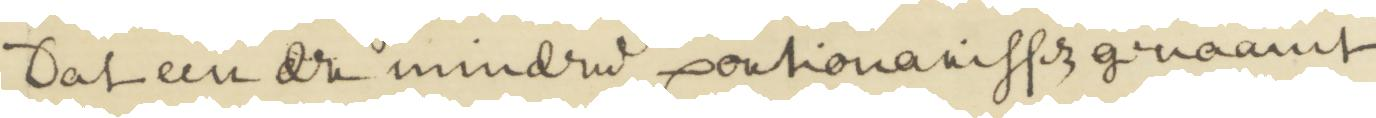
dat een der mindere portionarissen genaamt
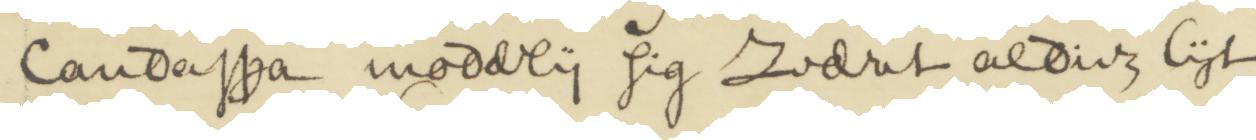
Candappa moddelij sig zedert aldien tijt
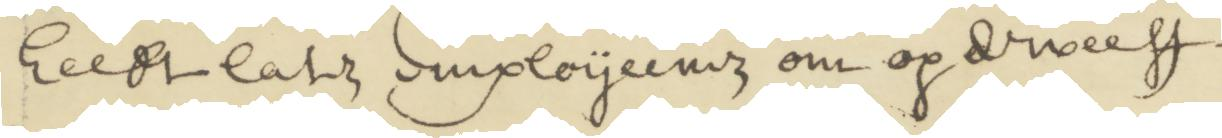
heeft laten Emploijeeren om op de weeff
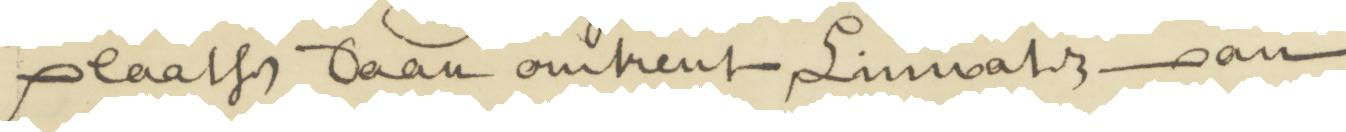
plaatsen daar omtrent, Linwaten van
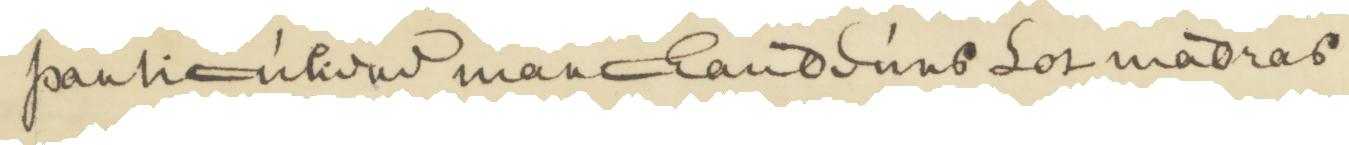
particuliere marchandeurs tot madras
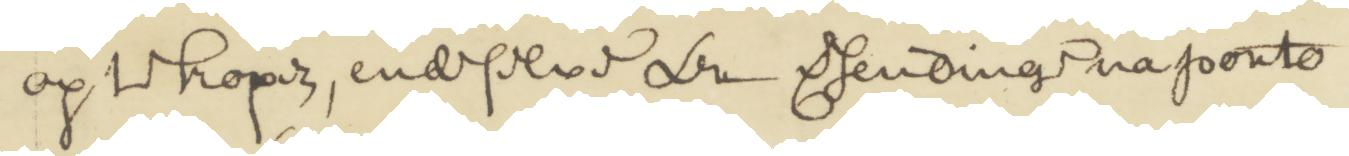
op te kopen, en deselve ter versendinge na porto
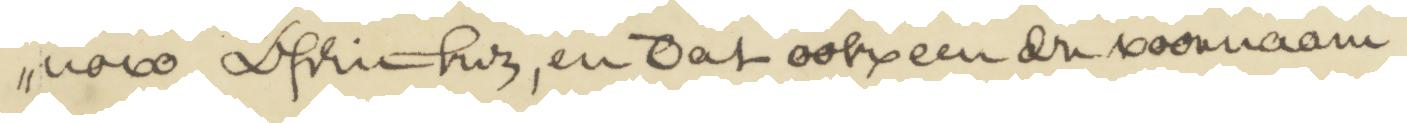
„novo teschicken, en dat ook een der voornaam
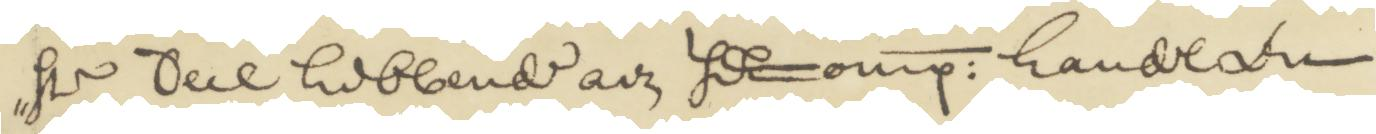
„ste deel hebbende aen 'sEcomp: handel ten
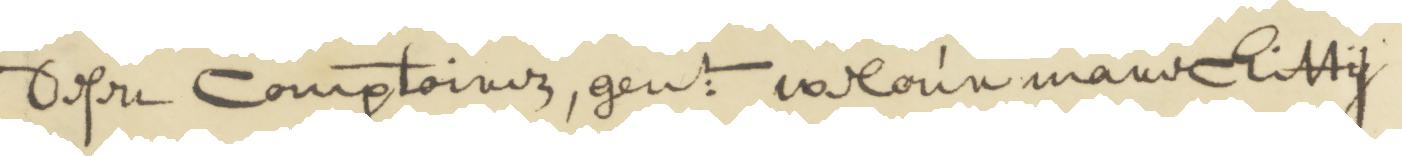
desen Comptoiren, gen:t welour marechittij
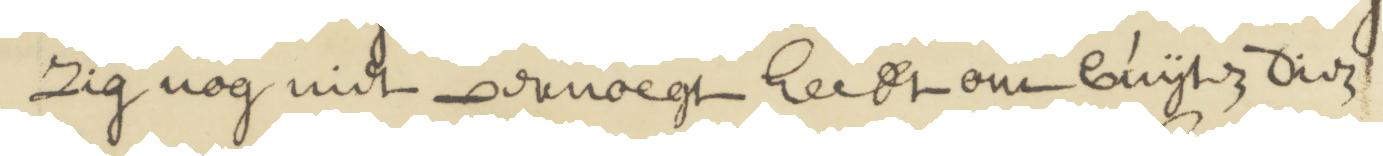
zig nog niet vernoegt heeft om buijten dien
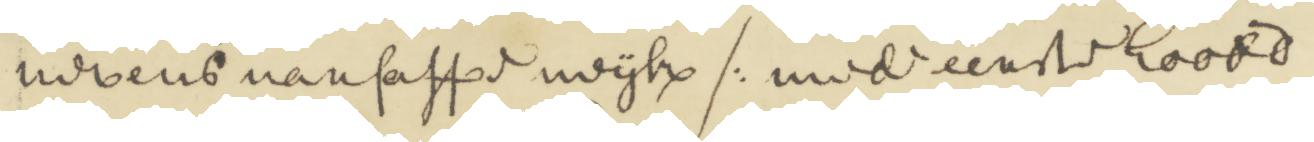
nevens narsappe neijk /: mede eerste hoofd
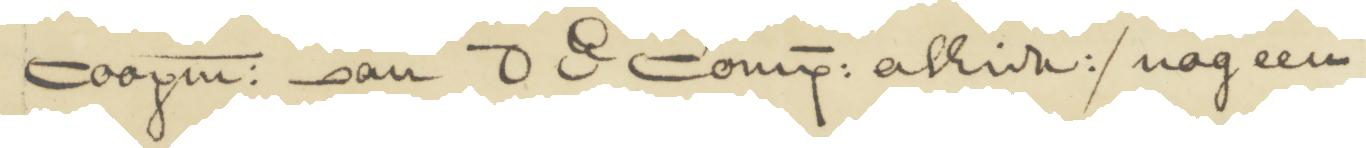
coopm: van d E Comp: alhier :/ nog een
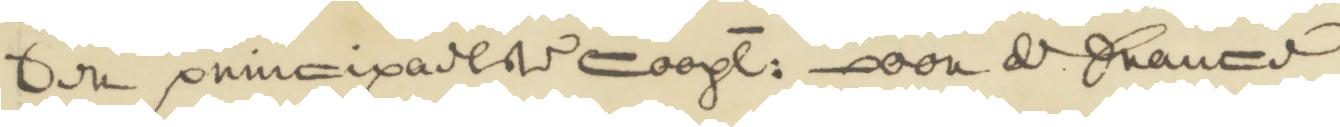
der principaelste coopl: voor de france
